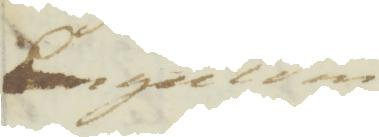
Een guldens
